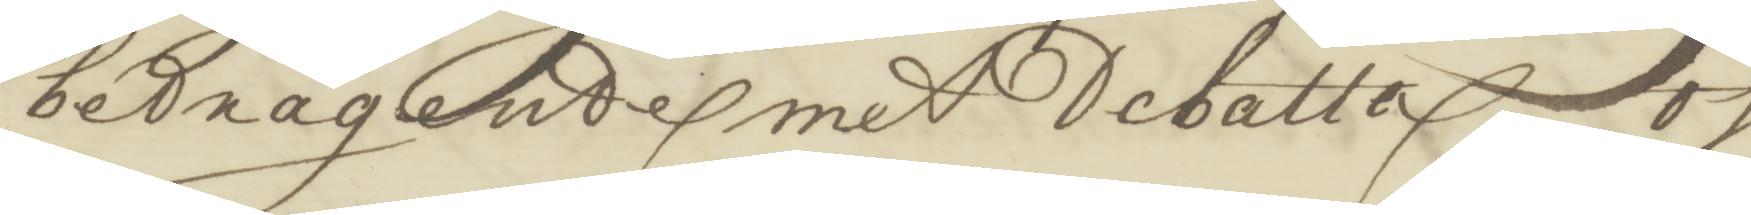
bedragende met de batta off
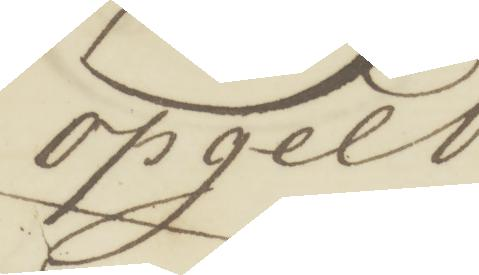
opgeld
